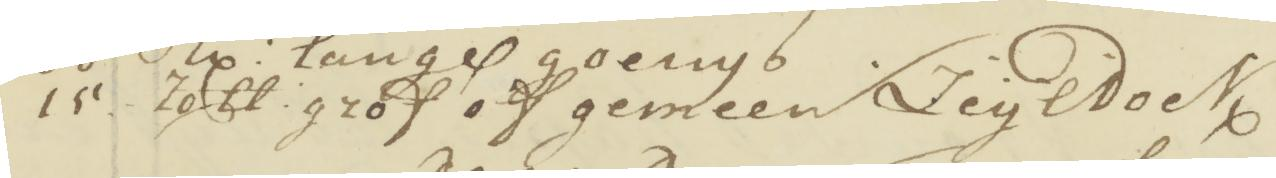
15 Roll: grof of gemeen Zeijldoek
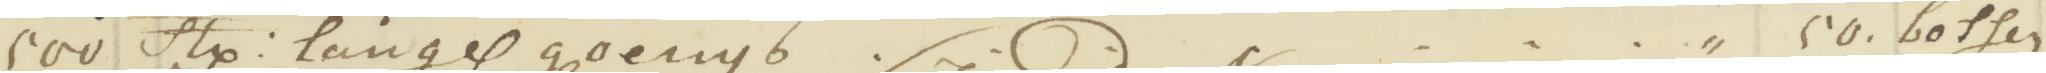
500 Stx: lange goenys . . . . . . . . „ 50. bossen
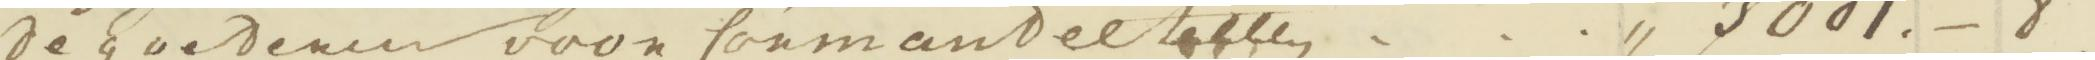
de goederen voor Cormandel tellen . . . „ 3001.— 8
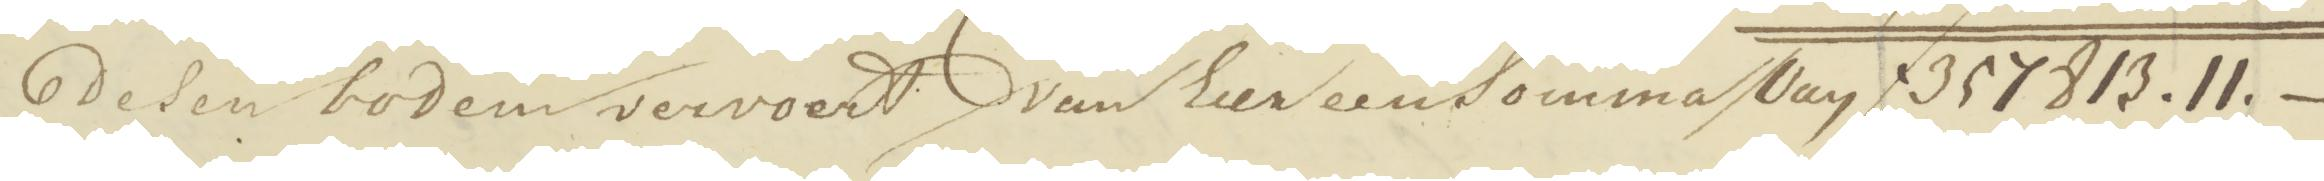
desen bodem vervoert van hier een Somma Van ƒ 357813.11.—
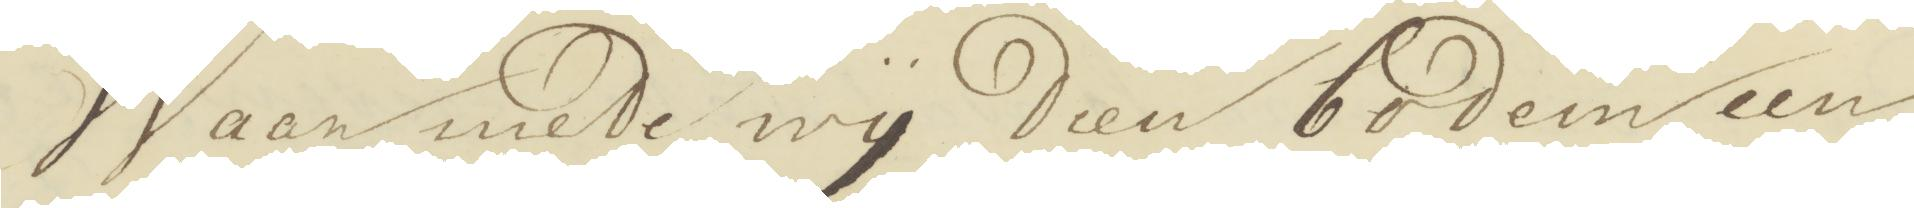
Waar mede wij dien bodem een
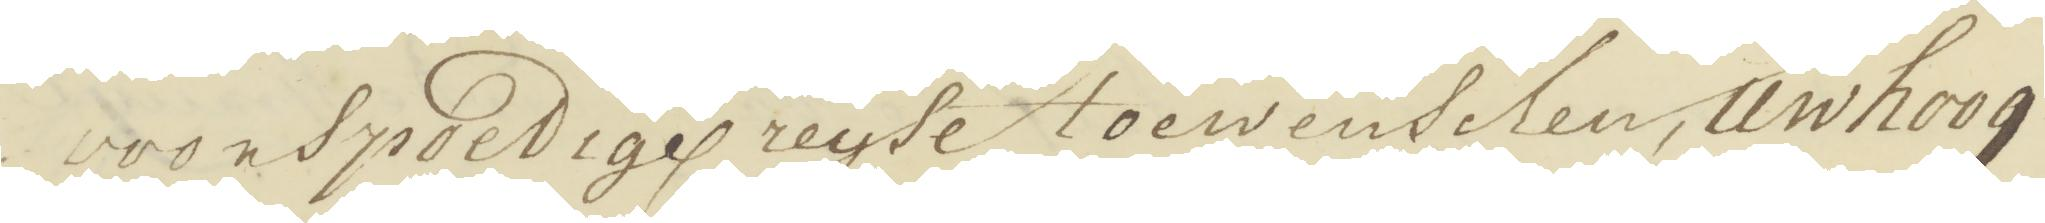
voor spoedige reijse toewenschen, uw hoog
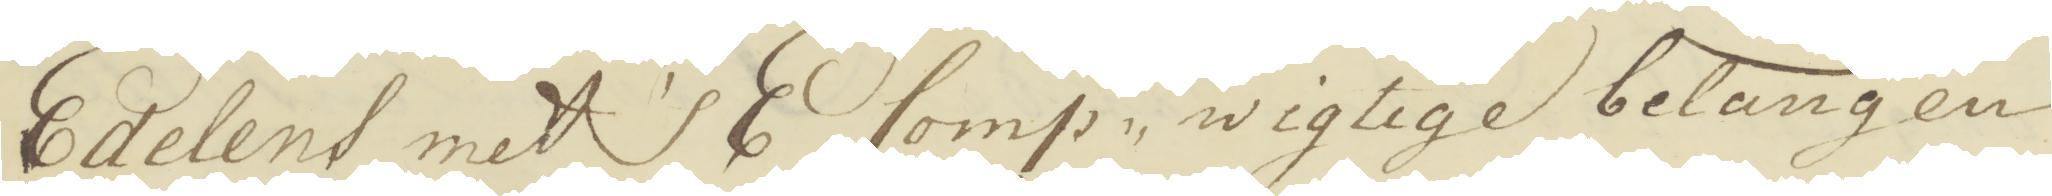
Edelens met 'S E Comp„s wigtige belangen
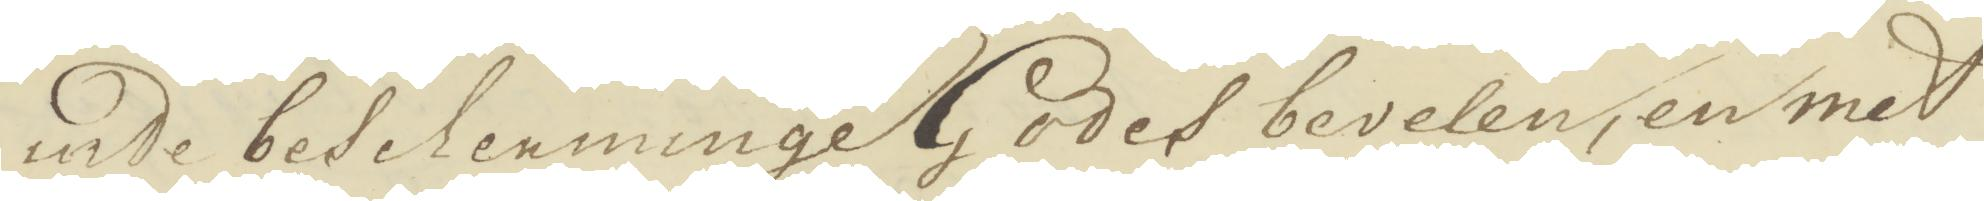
in de bescherminge Godes bevelen, en met
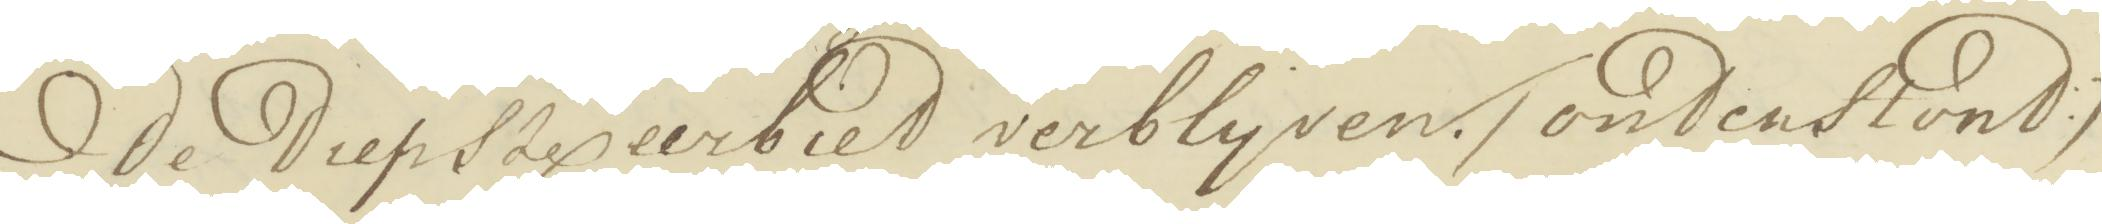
de diepste eerbied verblijven. /onderstond:/
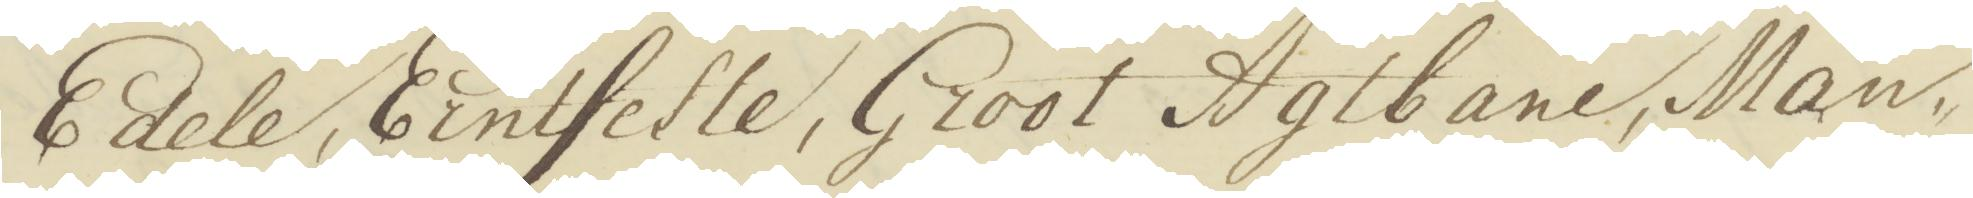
Edele, Erntfeste, Groot Agtbare, Man„
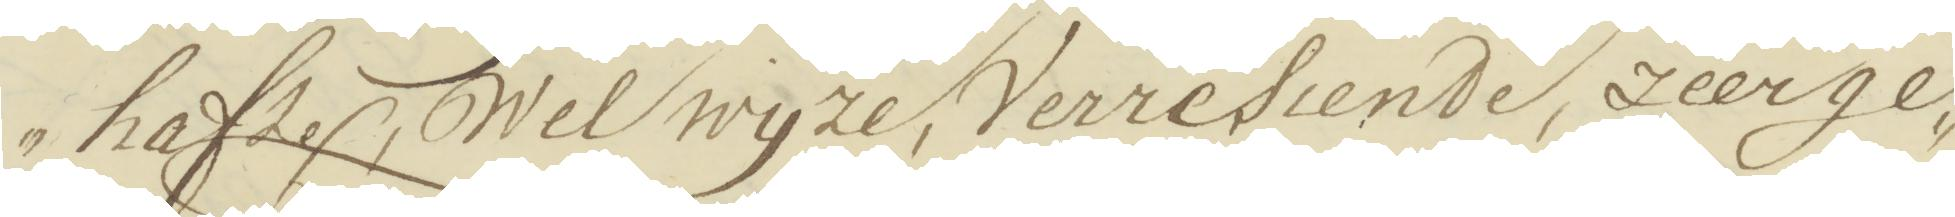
„hafte, wel wijze, Verresiende, zeer ge„
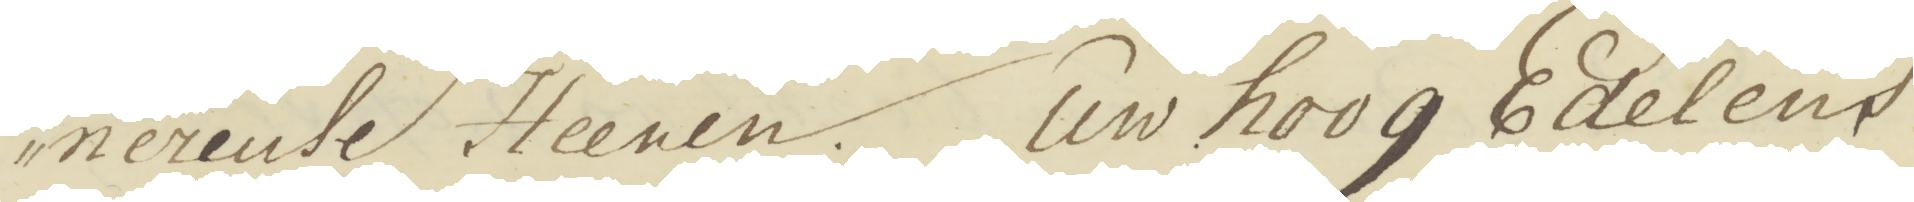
„nereuse Heeren. uw hoog Edelens
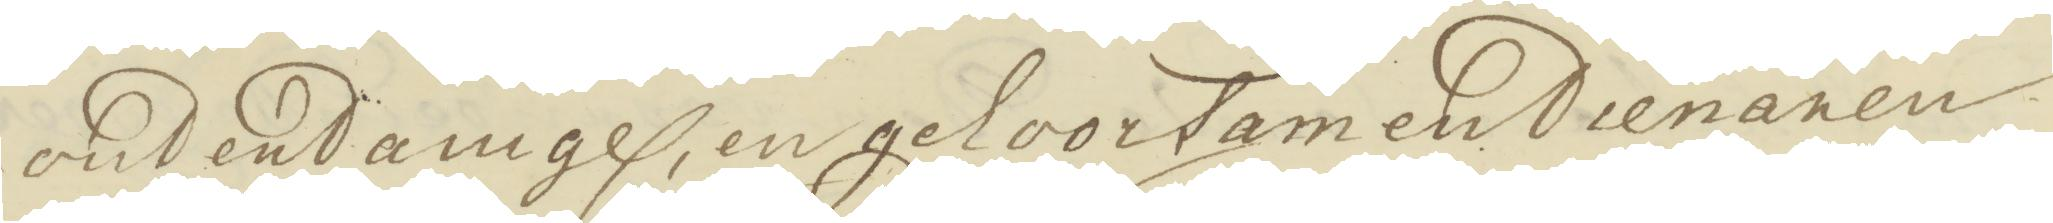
onderdanige, en gehoorsamen dienaren
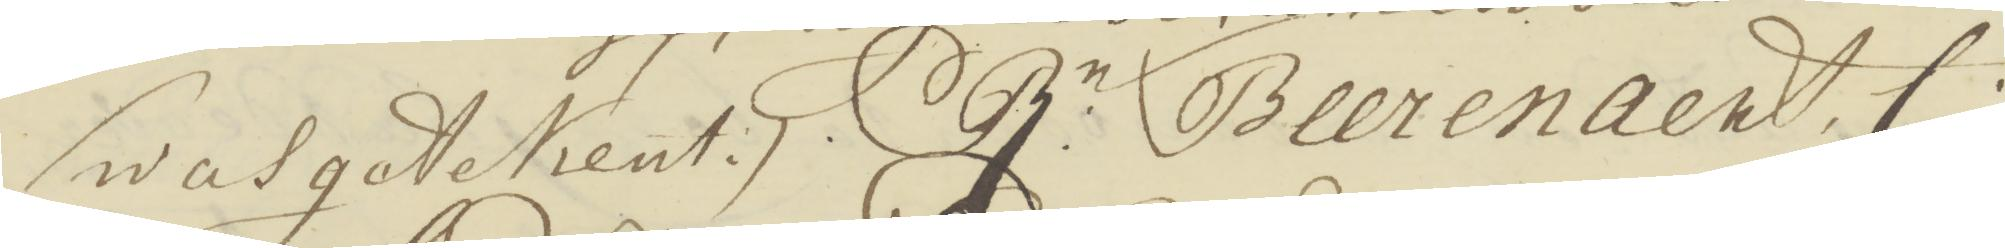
/ was getekent:/ R:r Beerenaert, C.s
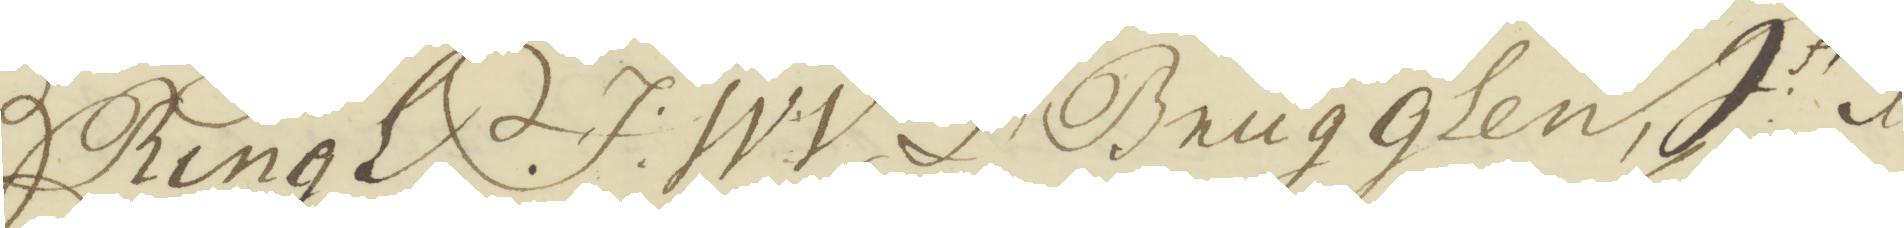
Ringh, J. W: V D Brugghen, J:s As
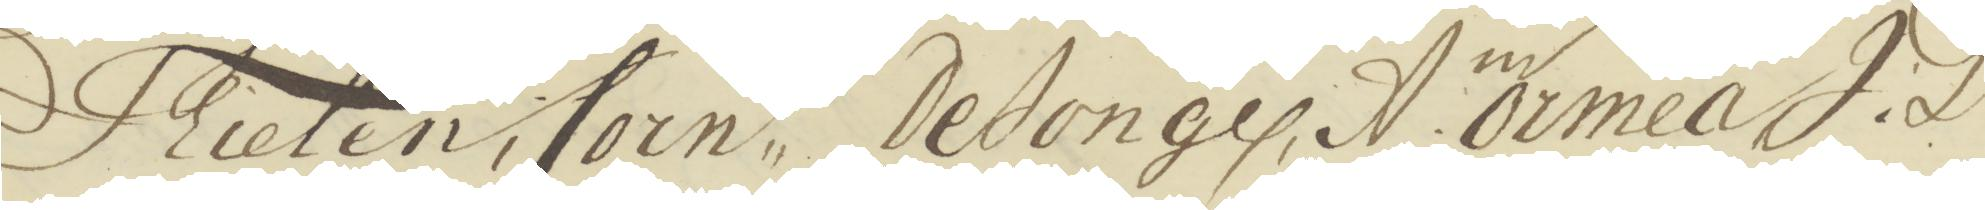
Thielen, Corn„s DeIonge, A:m Ormea, J:D
